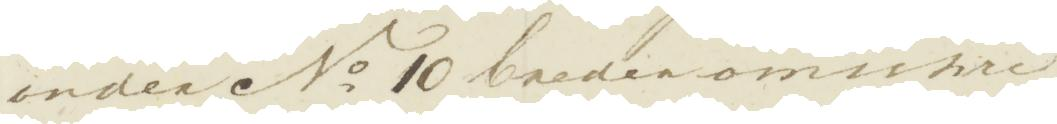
onder N.o 10 breder omschre
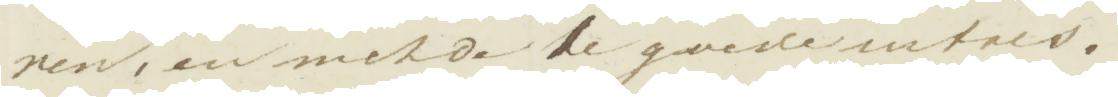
ven, en met de te goede intres„
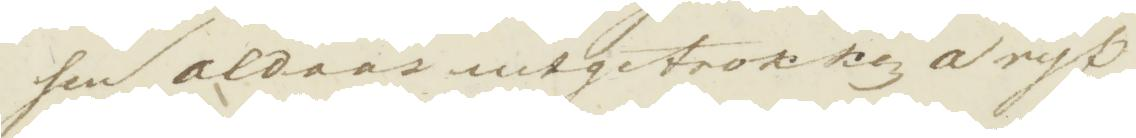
sen aldaar uitgetrokken a vyf
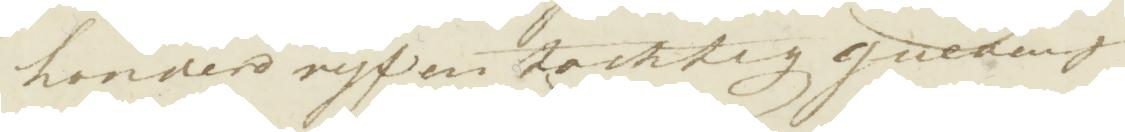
honderd vyf en tachtig guldens
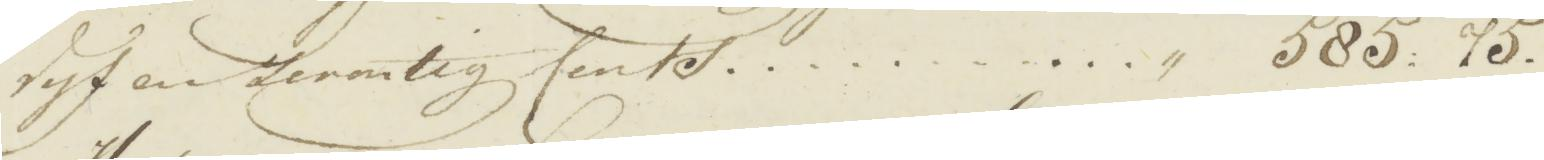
vyf en Zeventig Cents.. . . . . . . . . . . . „ 585: 75.
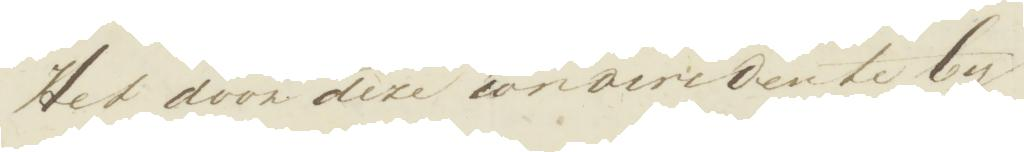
Het door deze condividente by
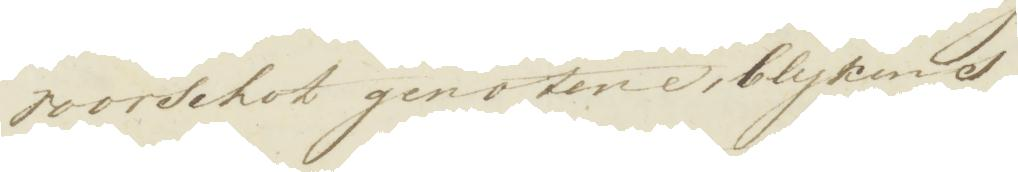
voorschot genotene, blykens
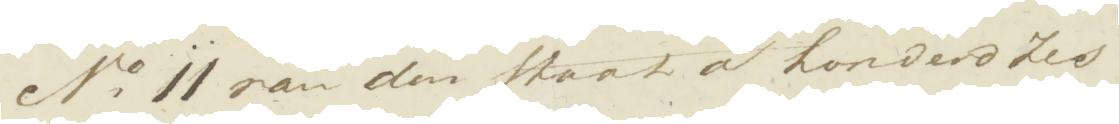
N.o 11 van den Staat a honderd Zes
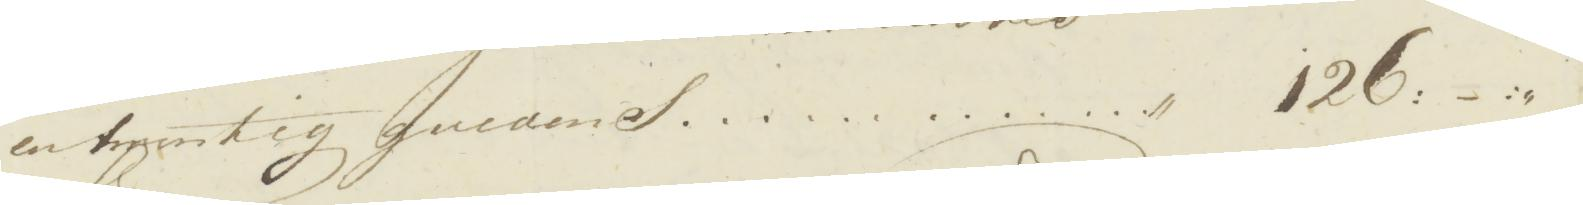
en twintig guldens.. . . . . . . . . . . . . „126:—:„
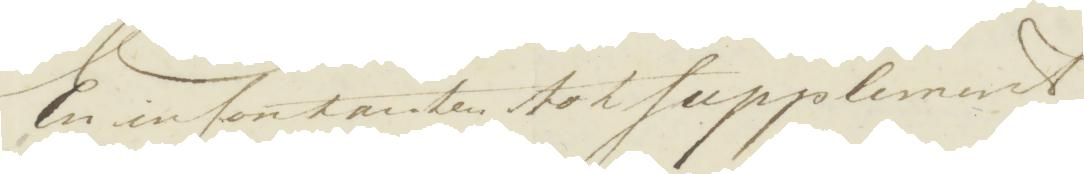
En in contanten tot Supplement
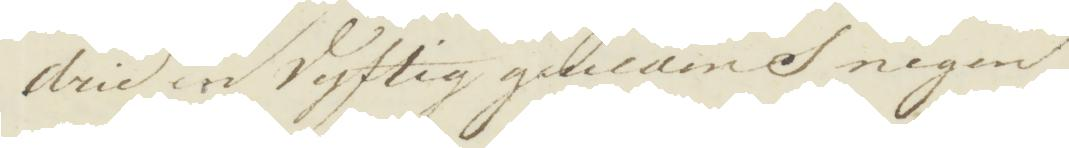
drie en Vyftig guldens negen
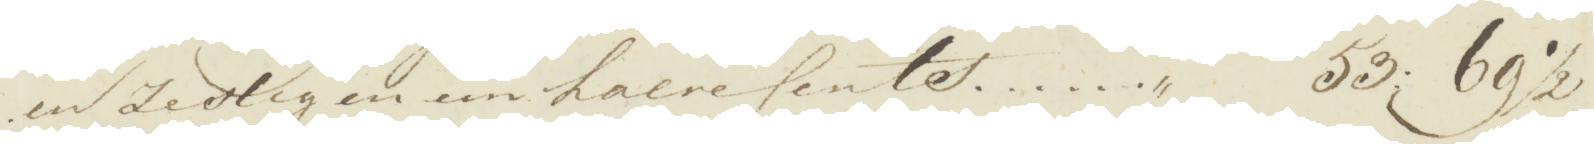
„en zestig en een halve Cents . . . . . . „ 53: 69½
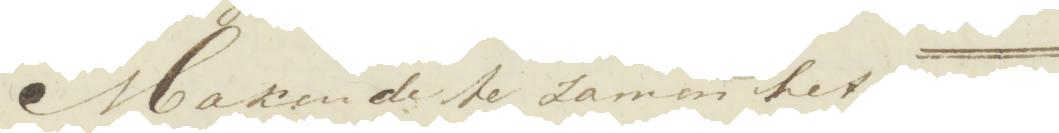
Makende te zamen het voor„
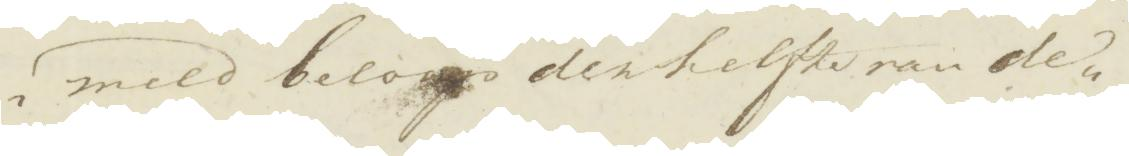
„meld beloop der helfte van de„
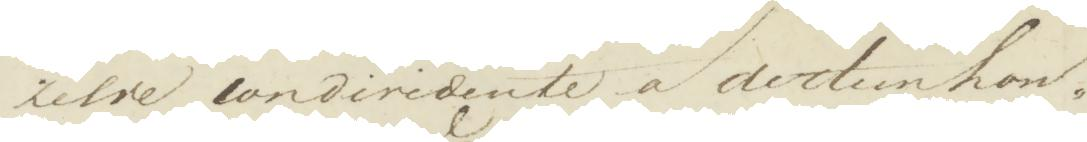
zelve condividente a dertien hon„
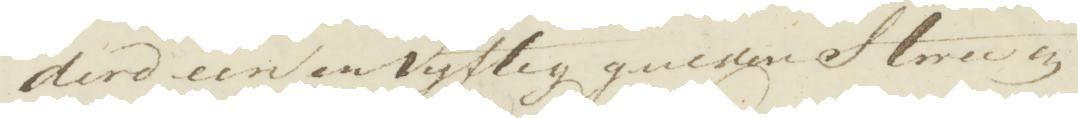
derd een en vyftig guldens twee en
